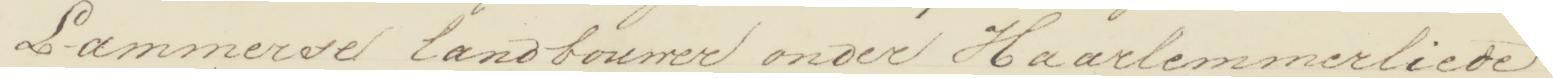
Lammerse landbouwer onder Haarlemmerliede
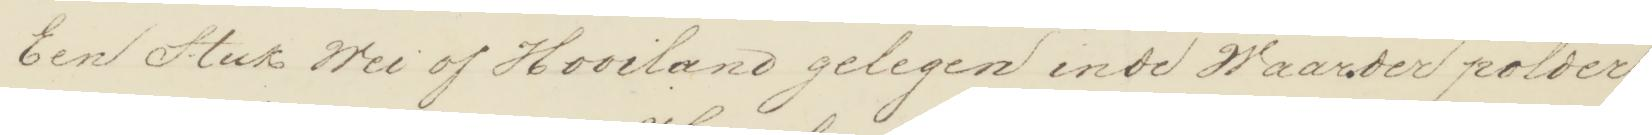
Een stuk Wei of Hooiland gelegen inde Waarder polder
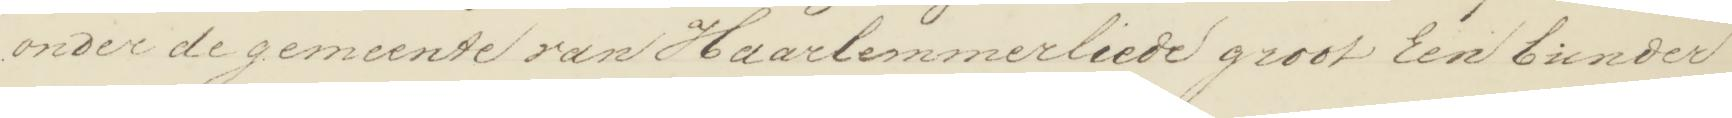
onder de gemeente van Haarlemmerliede groot Een bunder
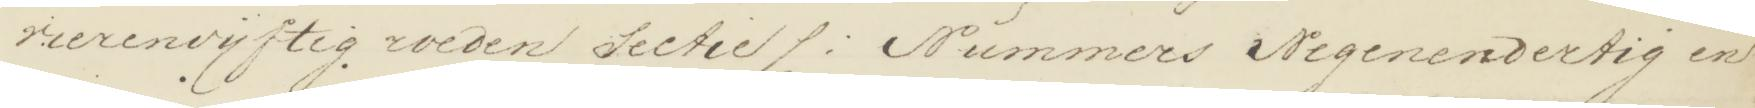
vierenvijftig roeden sectie C: Nummers Negenendertig en
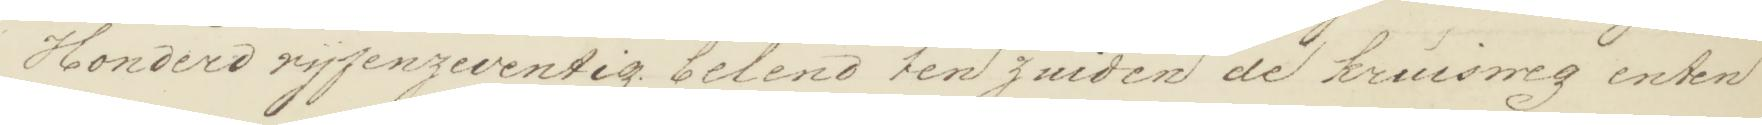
Honderd vijfenzeventig belend ten zuiden de kruisweg enten
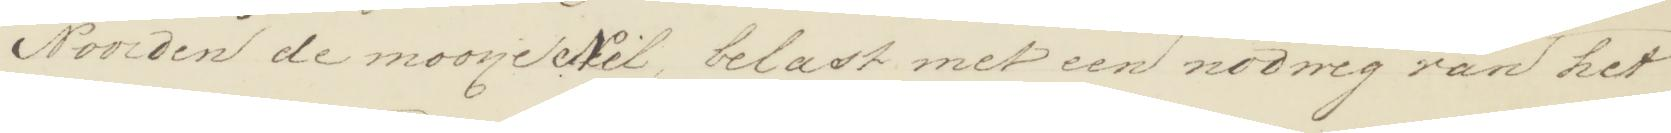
Noorden de mooije Nel, belast met een nodweg van het
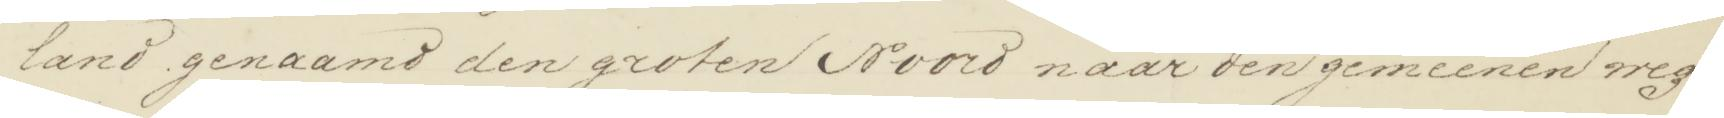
land genaamd den groten Noord naar den gemeenen weg.
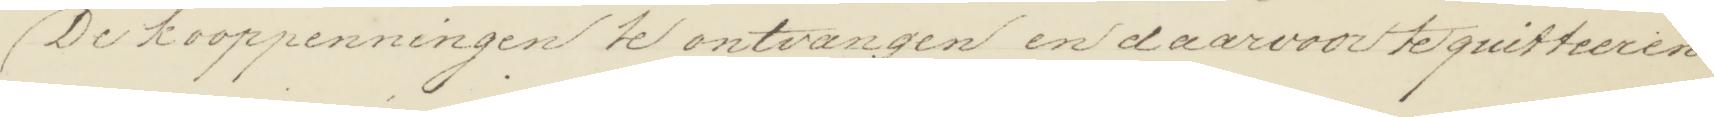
De kooppenningen te ontvangen en daarvoor te quitteeren
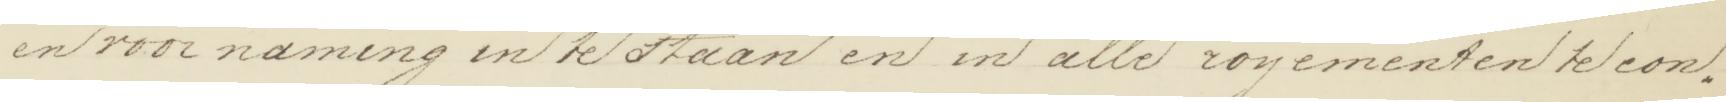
en voor naming in te staan en in alle royementen te con„
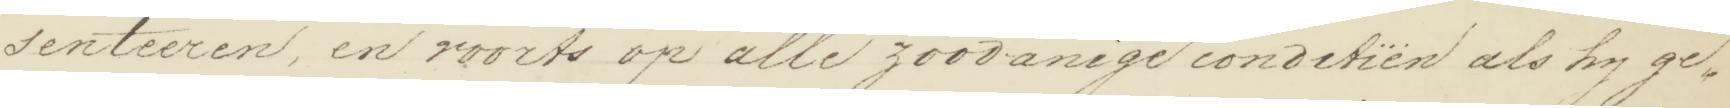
senteeren, en voorts op alle zoodanige conditiën als hy ge„
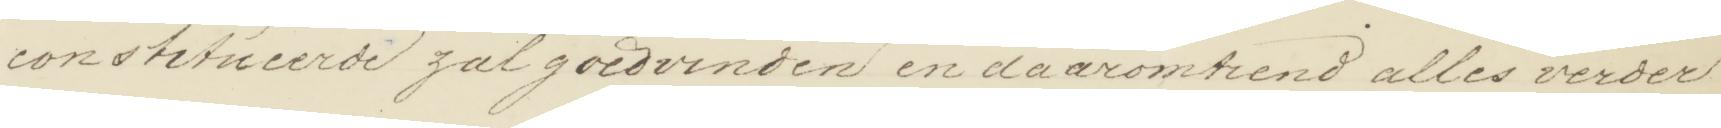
constitueerde zal goedvinden en daaromtrend alles verder
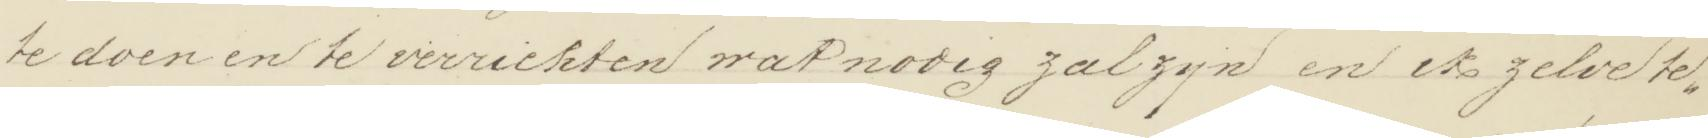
te doen en te verrichten wat nodig zal zijn en ik zelve te„
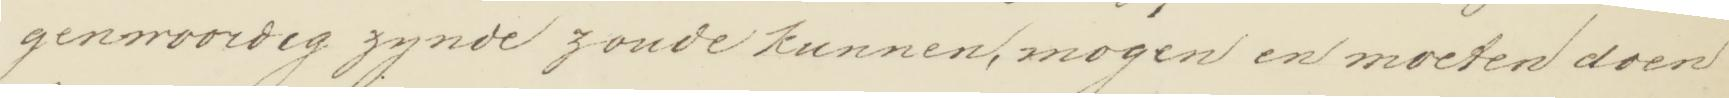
genwoordig zynde zoude kunnen, mogen en moeten doen
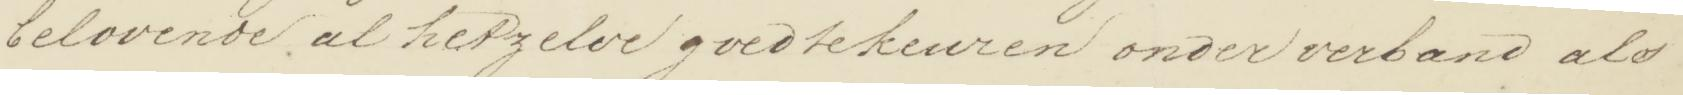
belovende al hetzelve goed tekeuren onder verband als
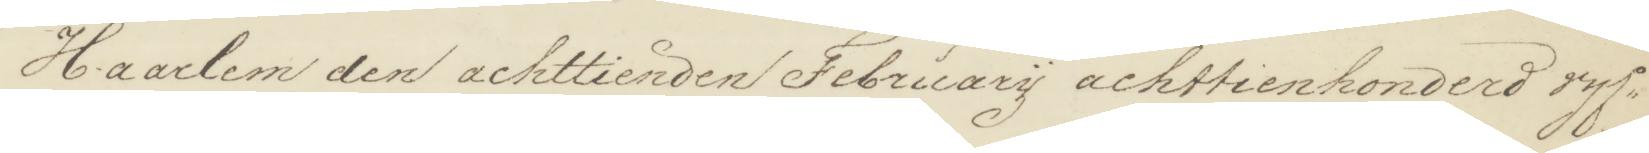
Haarlem den achttienden Februarij achttienhonderd vyf„
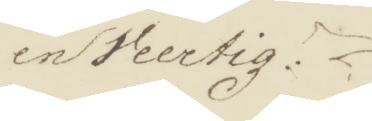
en Veertig. —
